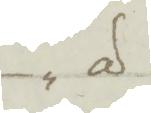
-„ a
